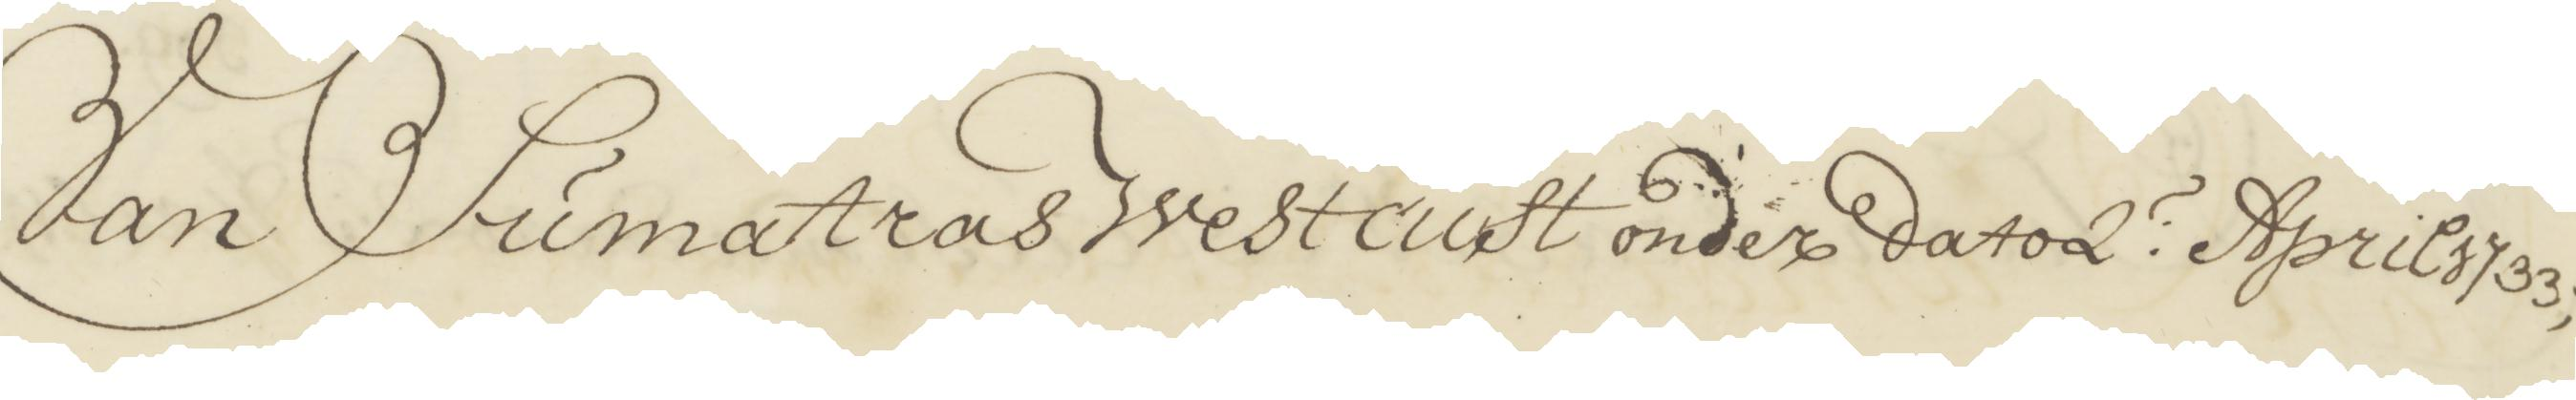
Van Sumatras Westcust onder dato 2:' April 1733;
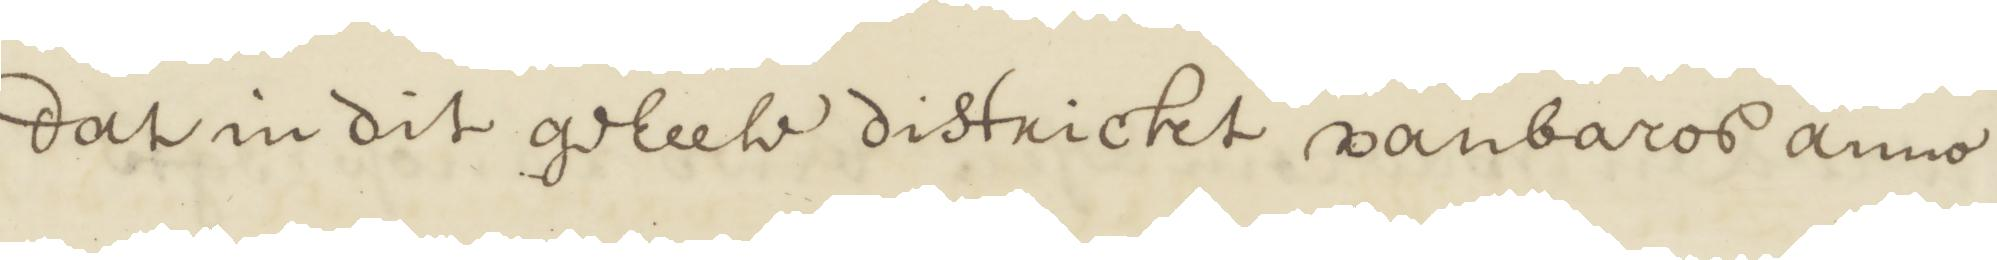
dat in dit geheele districkt van baros anno
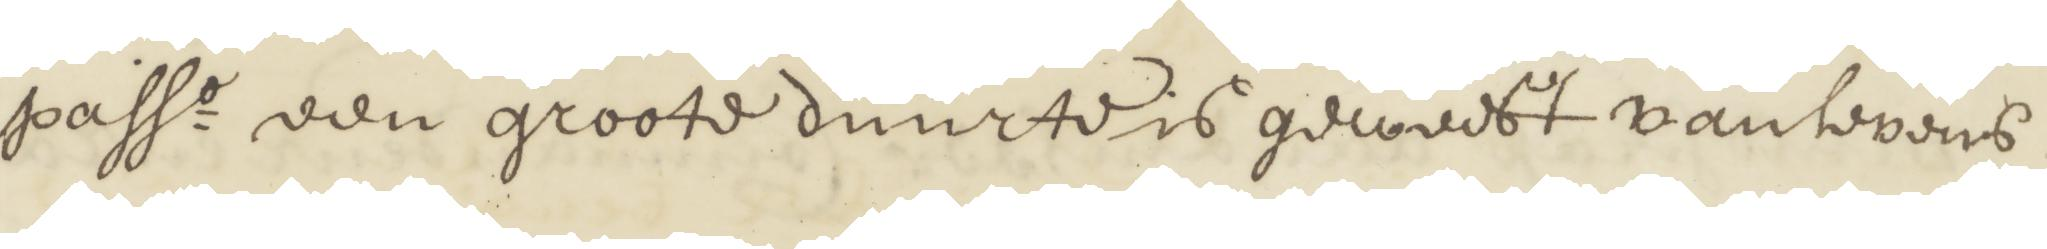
pass=o een groote duurte is geweest van levens
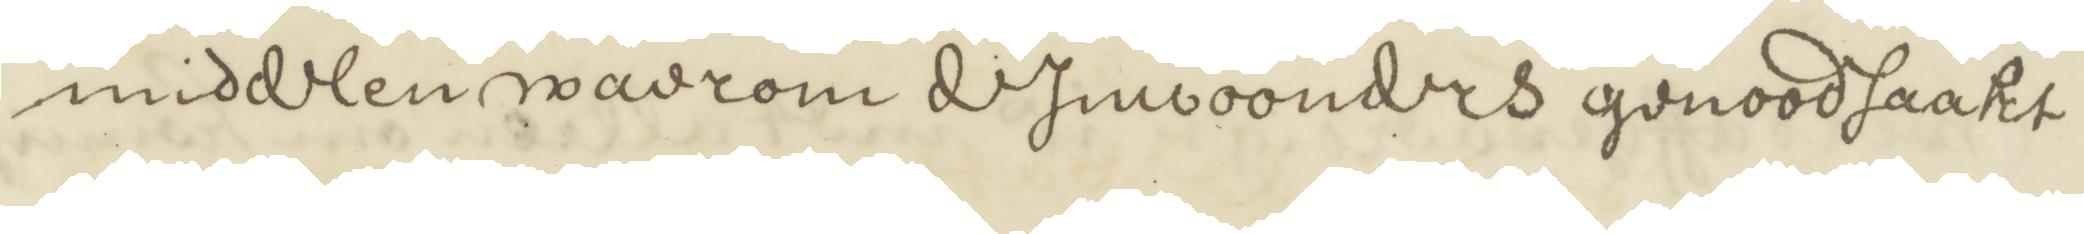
middelen waerom de jnwoonders genoodsaakt
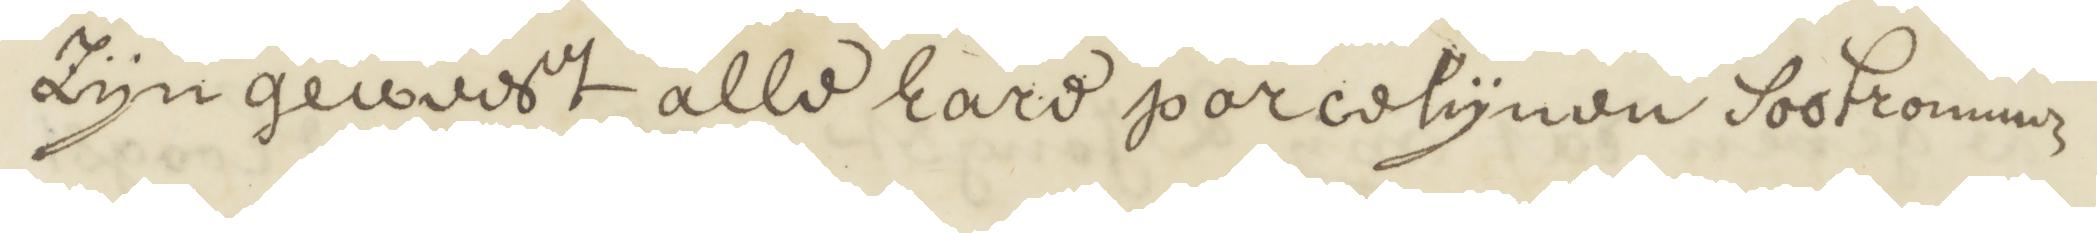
zijn geweest alle hare porcelijnen sookommen
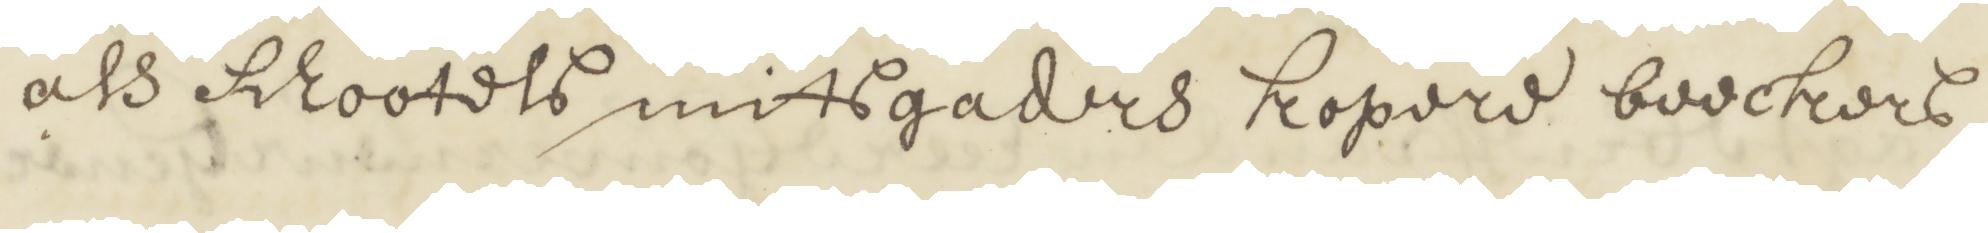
als schootels mitsgaders kopere beeckers
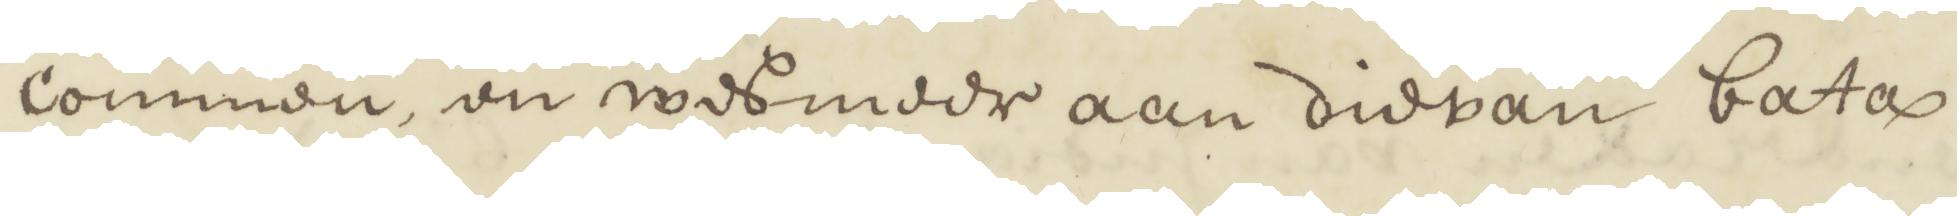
commen, en wesmeer aan die van bata
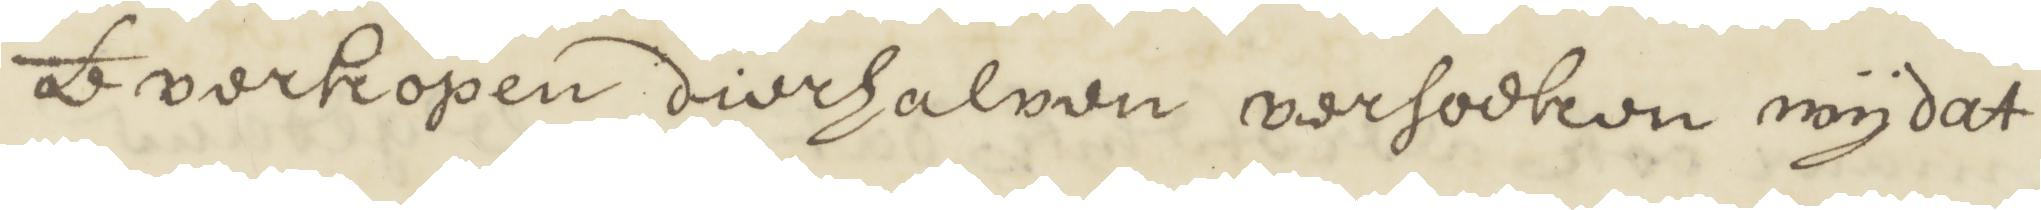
te verkopen dierhalven versoeken wij dat
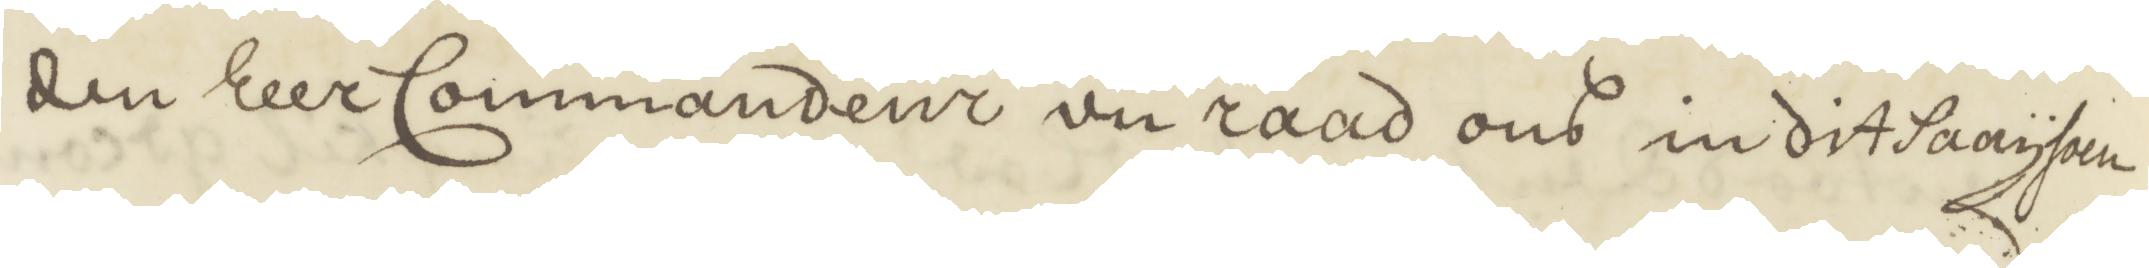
den heer Commandeur en raad ons in dit saaijsoen
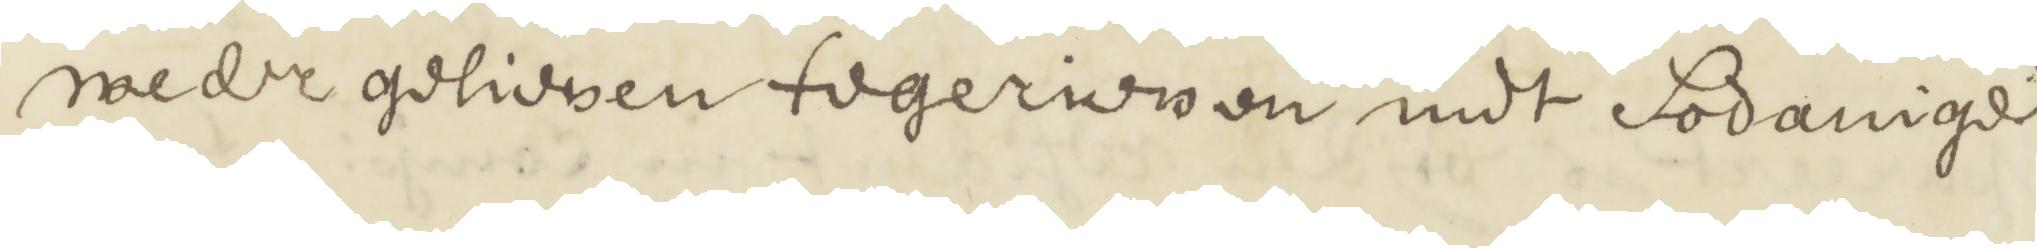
weder gelieven tegerieven met sodanige
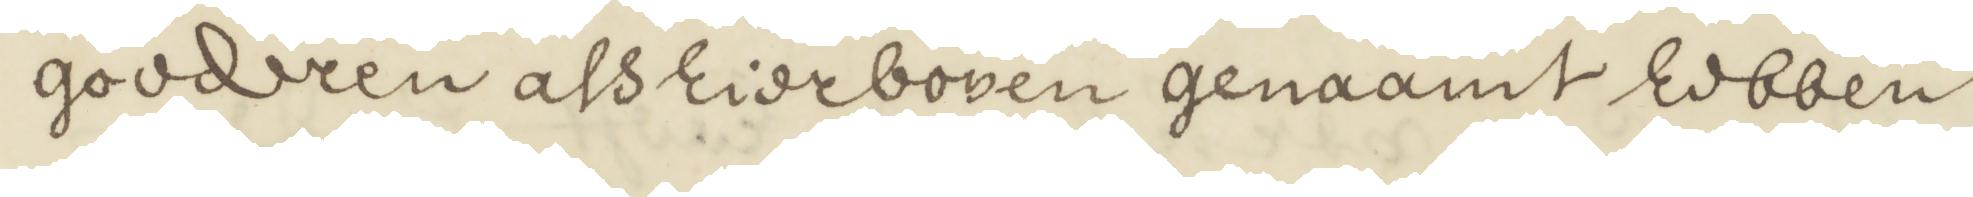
goederen als hierboven genaamt hebben
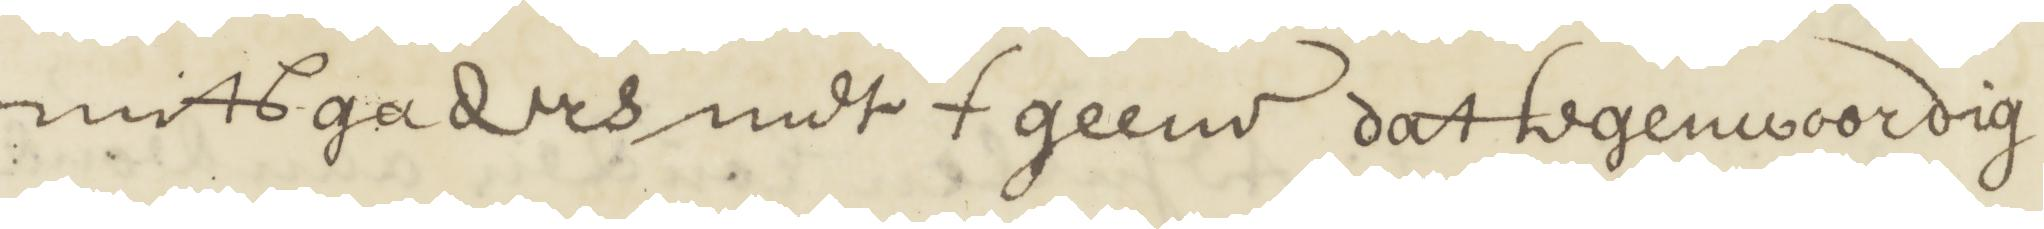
mits gaders met ’t geene dat tegenwoordig
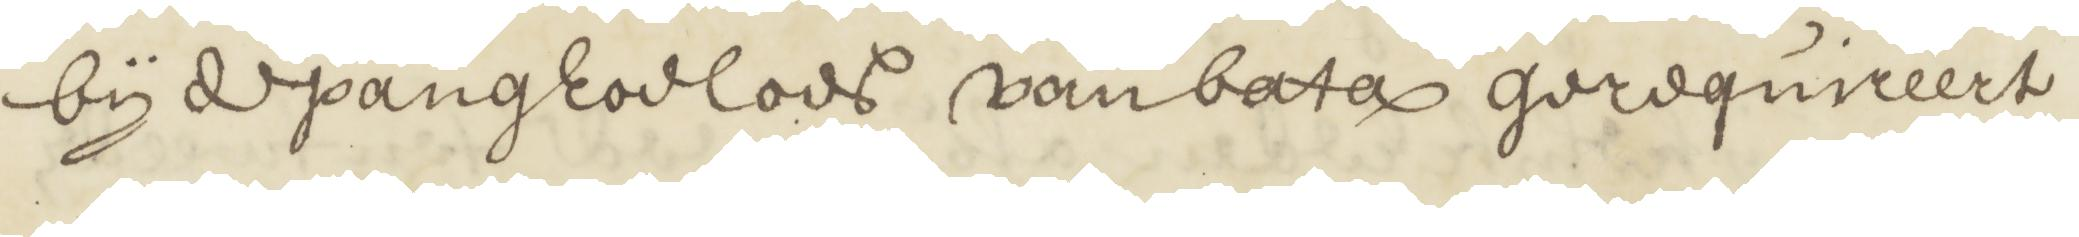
bij de panghoeloes van bata gerequireert
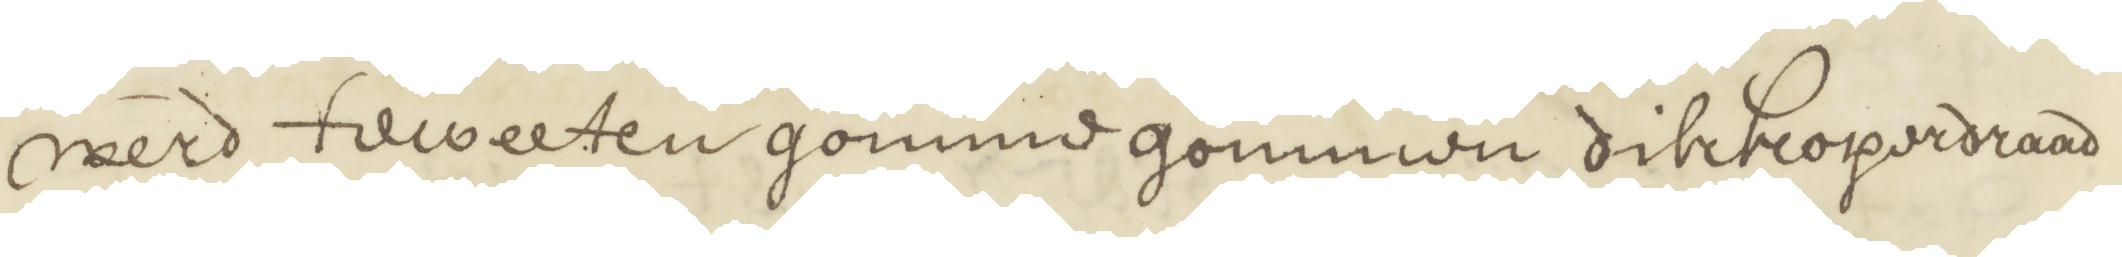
werd te weeten gomme gommen dikkoperdraad
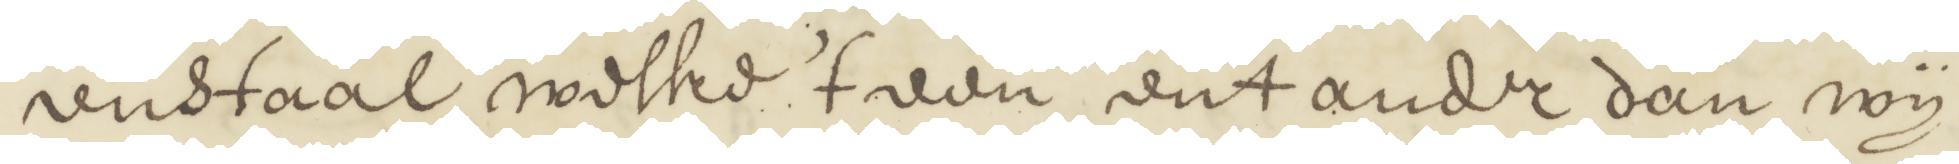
en staal welke ’t een en't ander dan wij
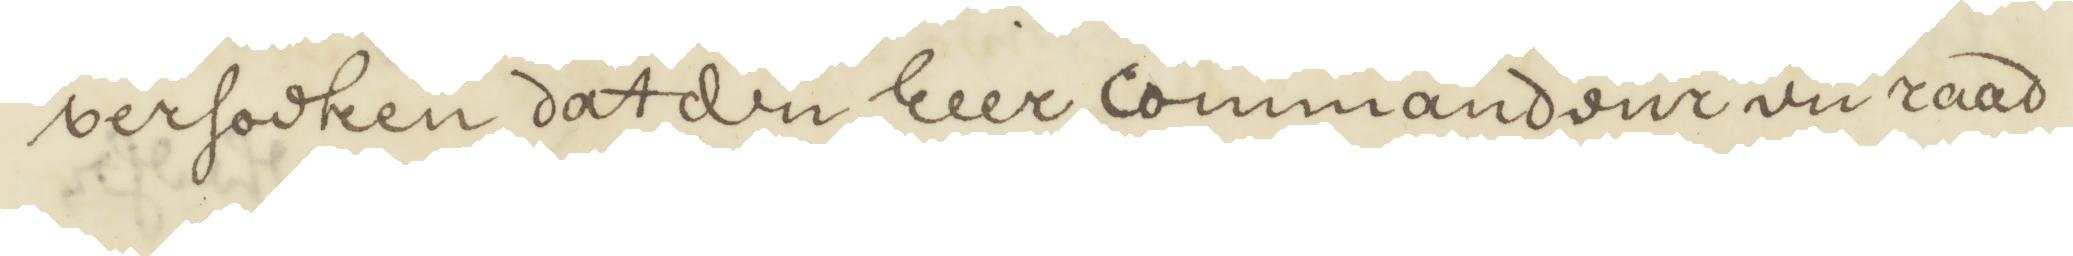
versoeken dat den heer commandeur en raad
